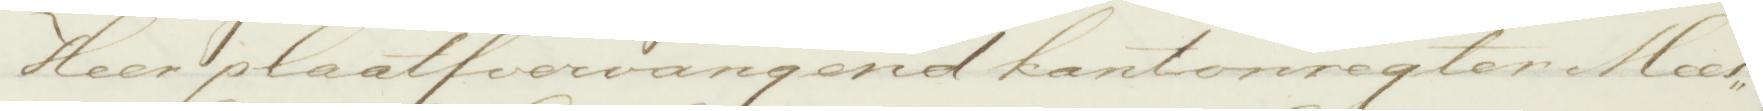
Heer plaatsvervangend kantonregter Mees„
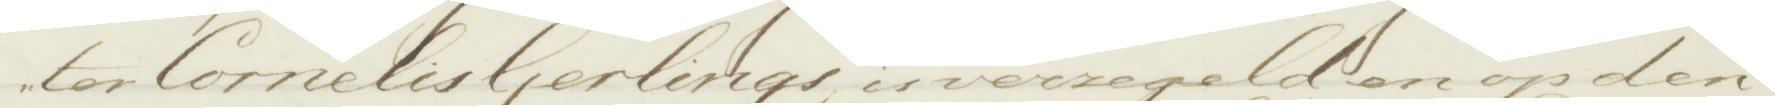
„ter Cornelis Gerlings, is verzegeld en op den
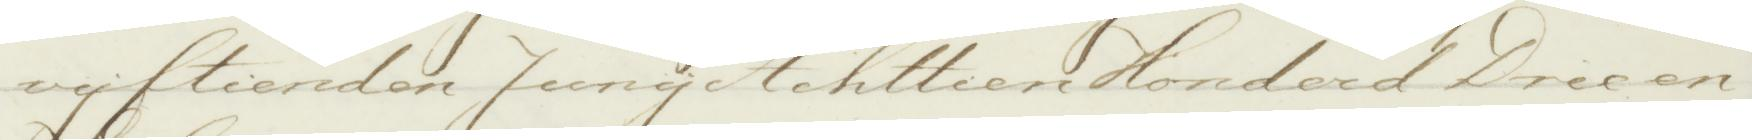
vijftienden Junij Achttien Honderd Drie en
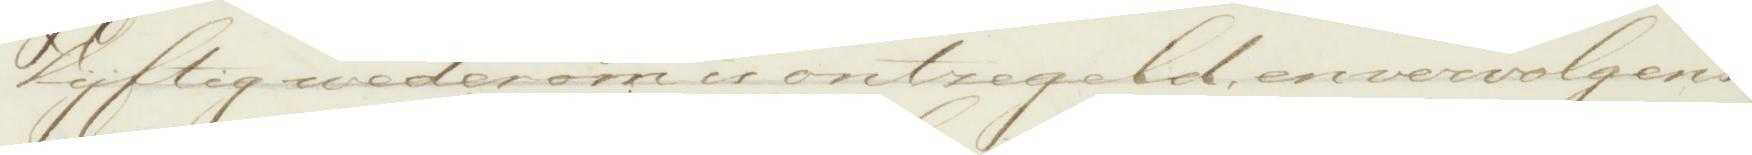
Vijftig wederom is ontzegeld, en vervolgens
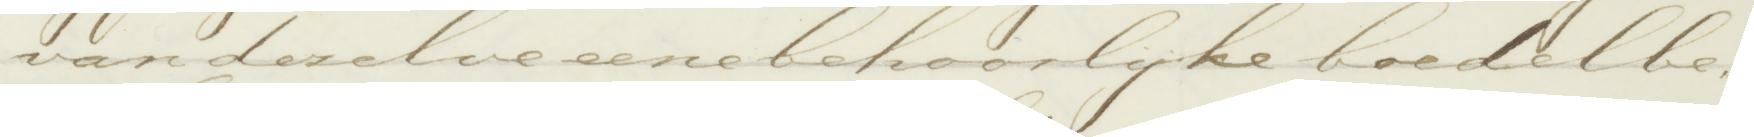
van dezelve eene behoorlijke boedelbe„
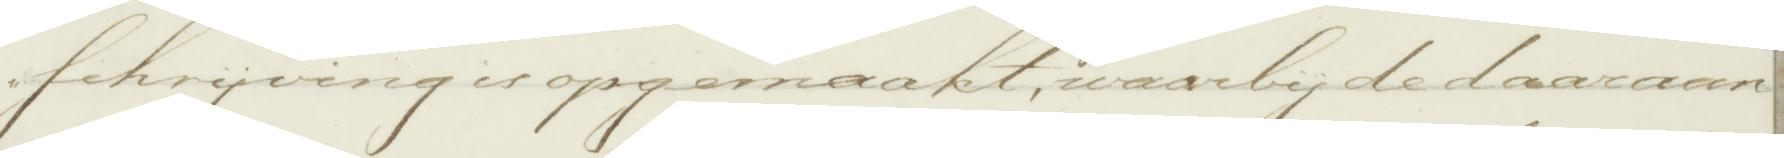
„schrijving is opgemaakt, waarbij de daaraan
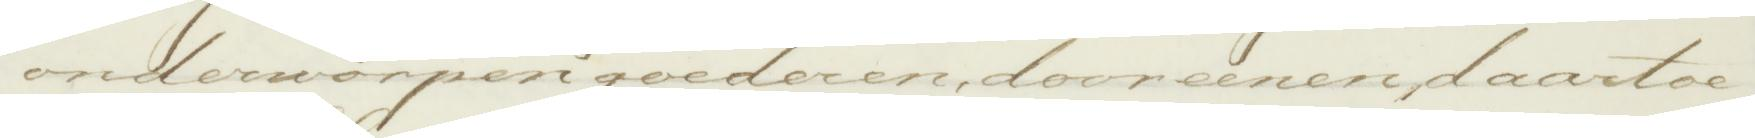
onderworpen goederen, door eenen, daartoe
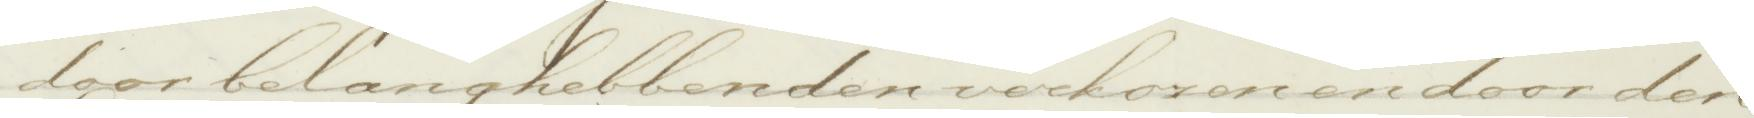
door belanghebbenden verkozen en door den
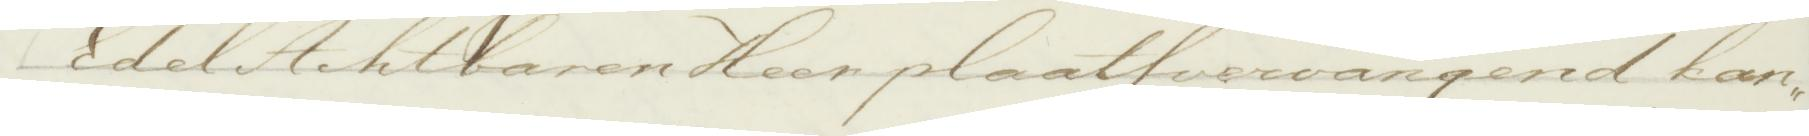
Edel Achtbaren Heer plaatsvervangend kan„
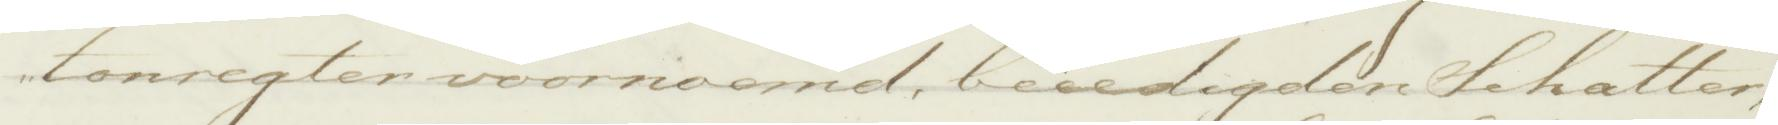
„tonregter voornoemd, beëedigden schatter,
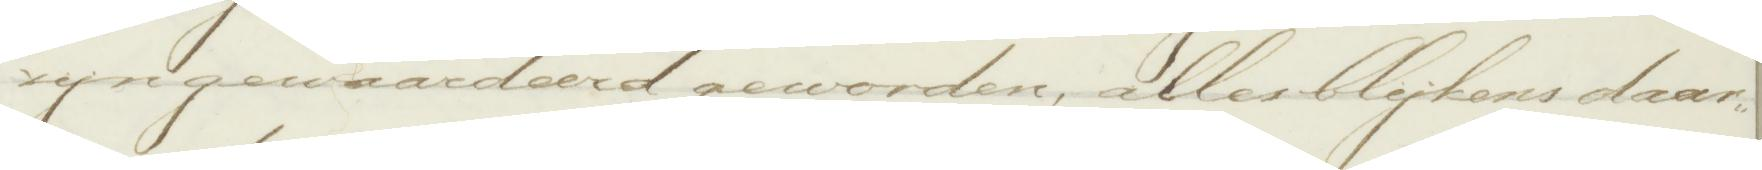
zijn gewaardeerd geworden, alles blijkens daar„
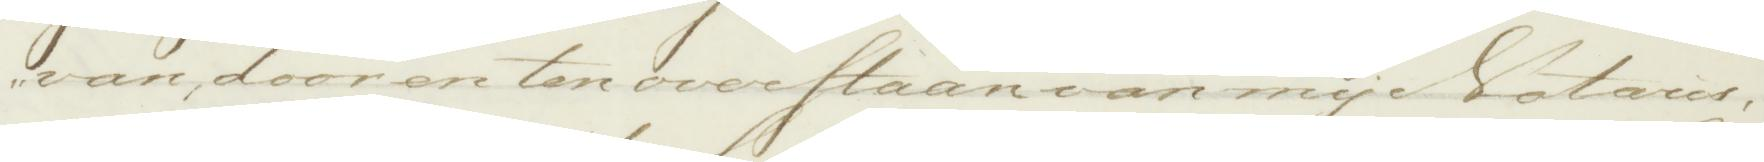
„van, door en ten overstaan van mij Notaris,
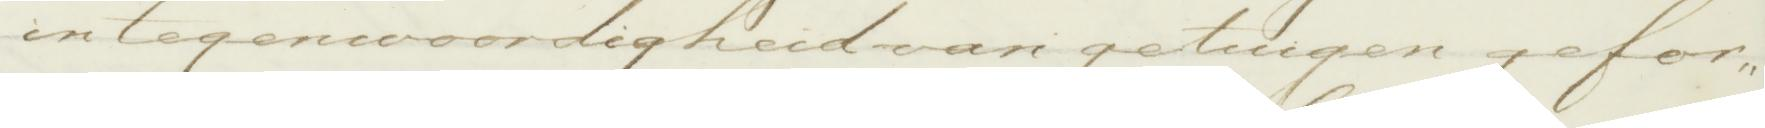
in tegenwoordigheid van getuigen gefor„
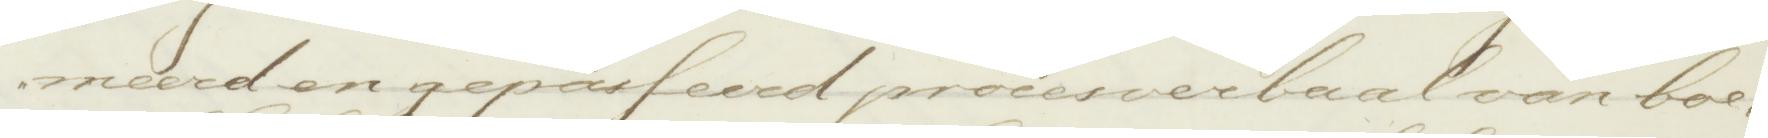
„meerd en gepasseerd procesverbaal van boe„
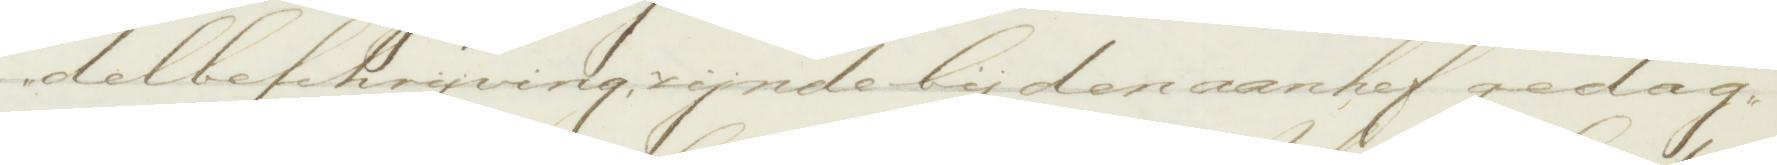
„delbeschrijving, zijnde bij den aanhef gedag„
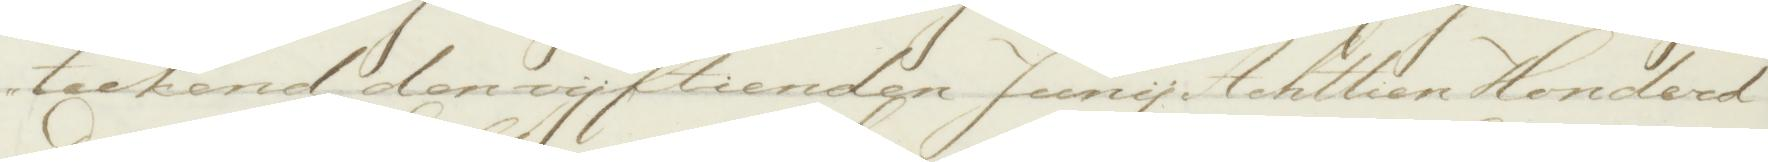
„teekend, den vijftienden Junij Achttien Honderd
